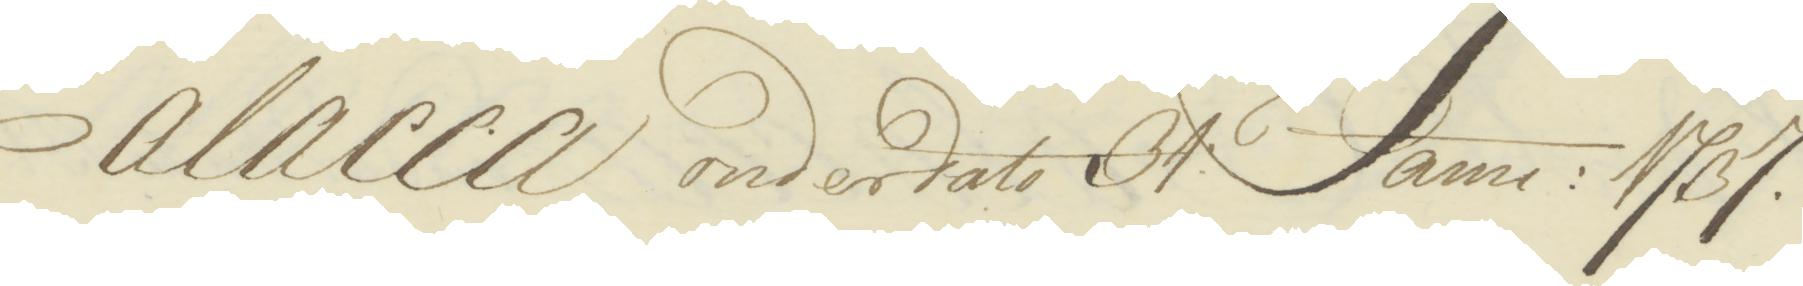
Van Malacca onder dato 31:' Janu: 1737.
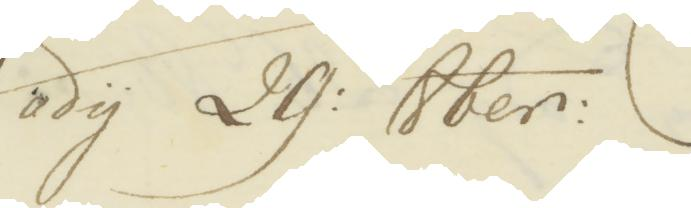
adij 29:' 8ber:
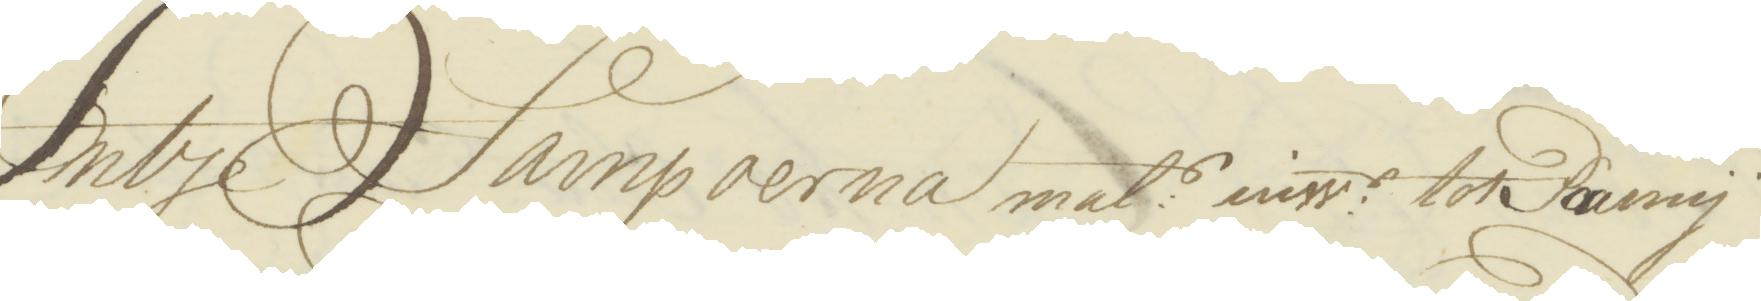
Intje Tampoerna mal:s inw:s tot Pannij
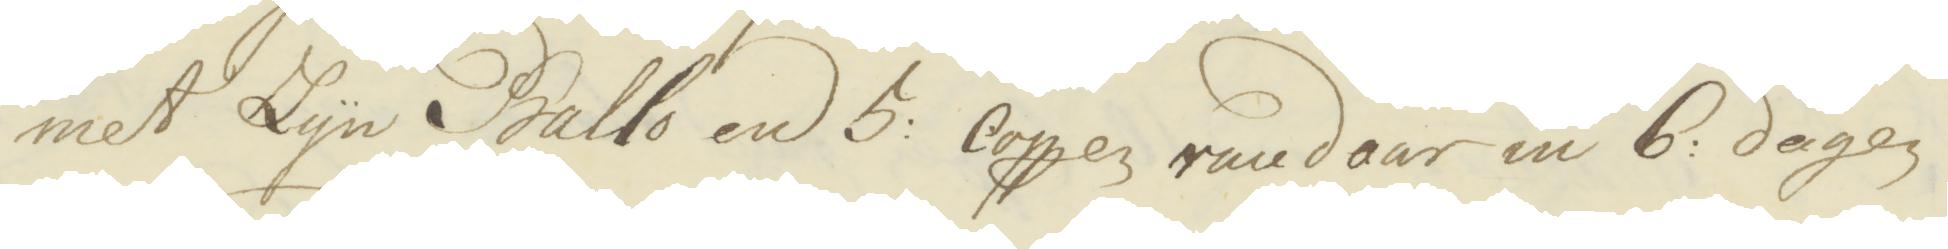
met zijn Ballo en 5: Coppen vandaar en 6: dagen
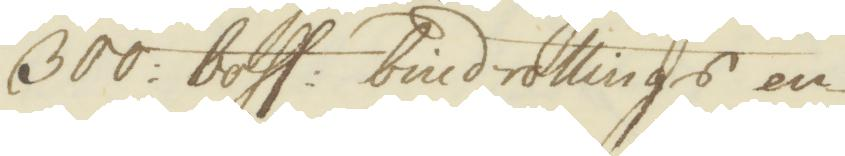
300: boss: bindrottings en
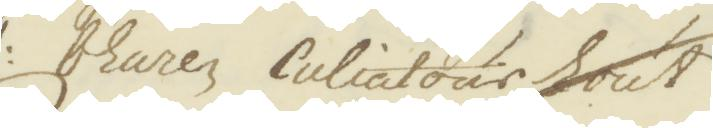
4: bharen Culiatous hout
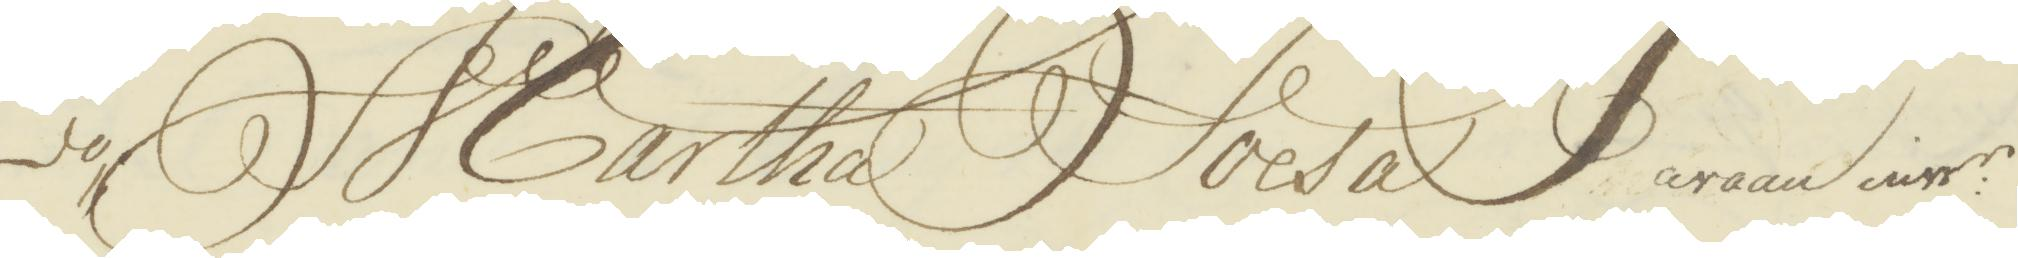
_„o Martha Soesa Javaan inw:s
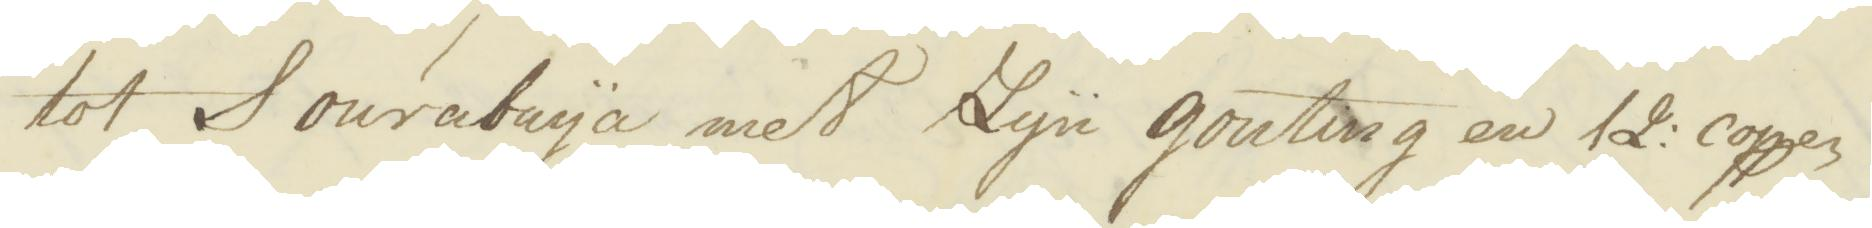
tot sourabaija met zijn gonting en 12: coppen
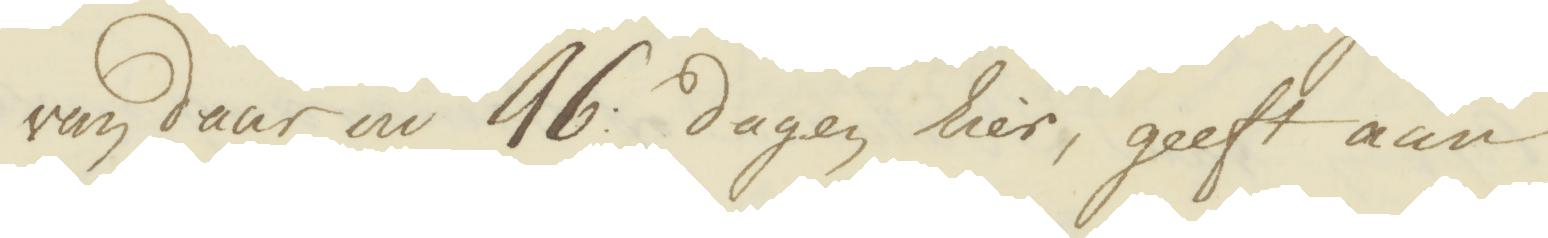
van daar in 46: dagen hier, geeft aan
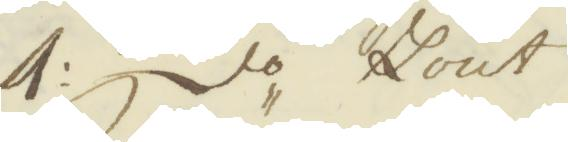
4: d„o zout
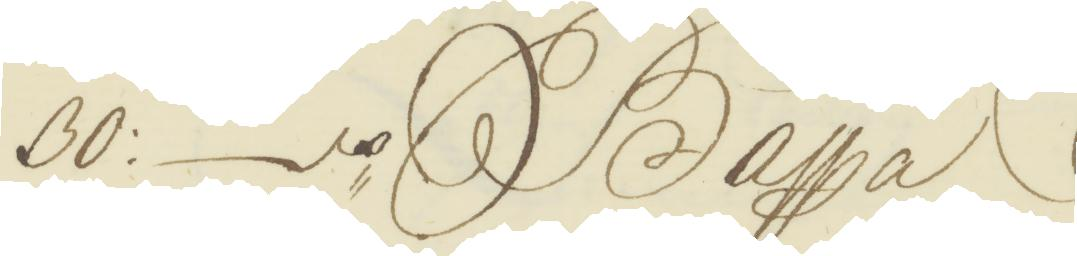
30: _„o Bappa
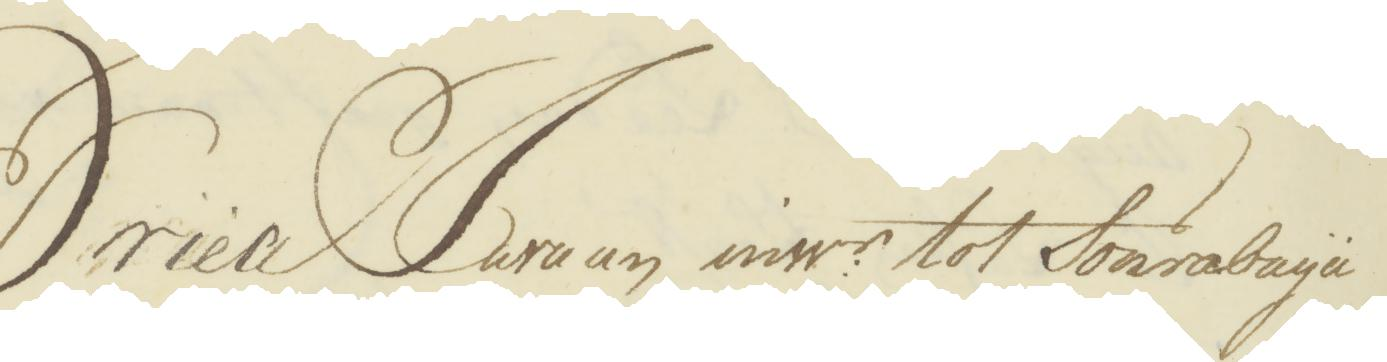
Driea Javaan inw:s tot sourabaija
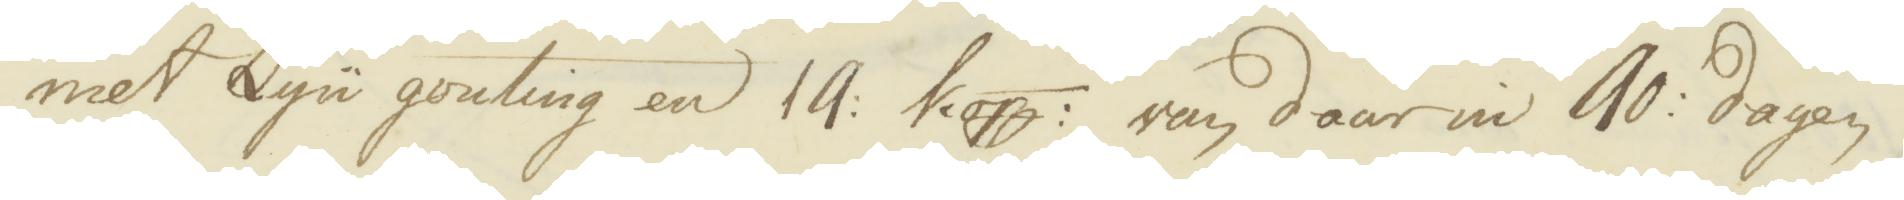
met zijn gonting en 14: kopp: van daar in 40: dagen
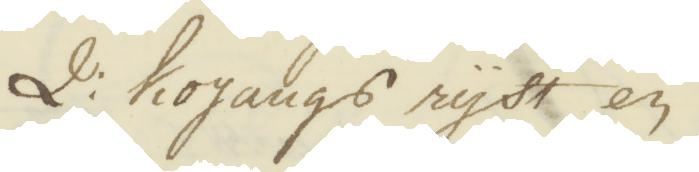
2: kojangs rijst en
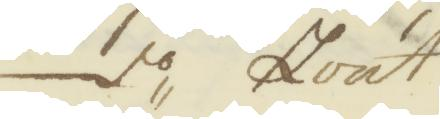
4: _„o zout
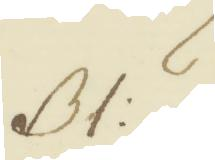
31:'
